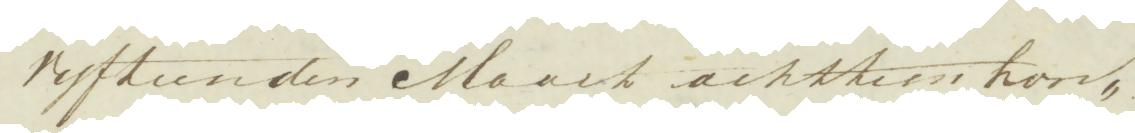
vyftienden Maart achttien hon„
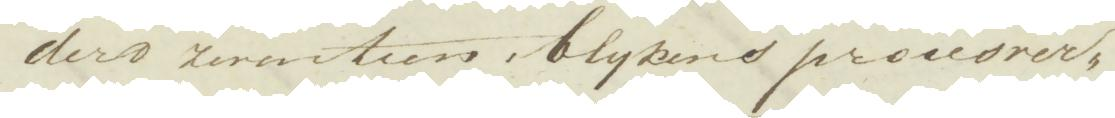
derd zeventien blykens procesver„
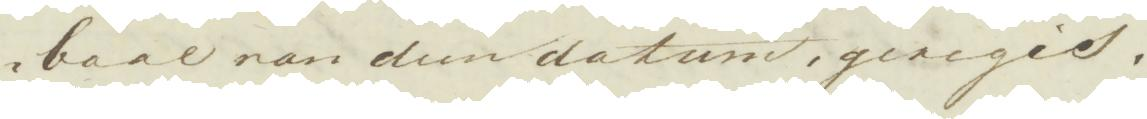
„baal van dien datum, geregis,
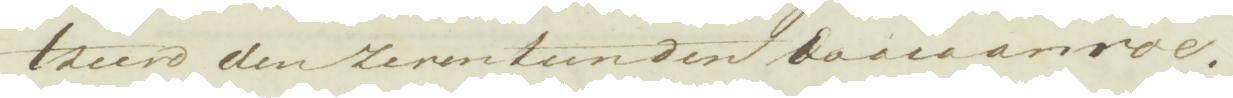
treerd den zeventienden daaraan vol„
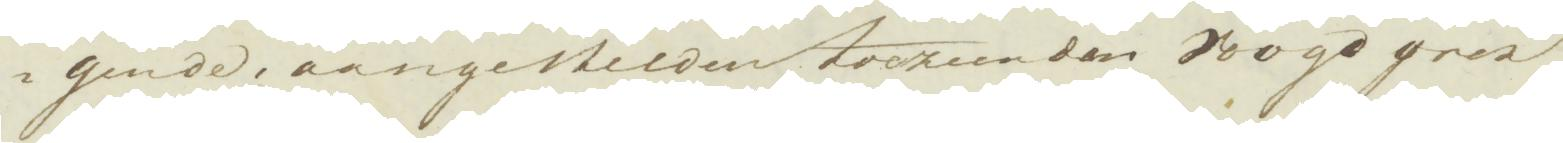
„gende, aangestelden toezien den voogd over
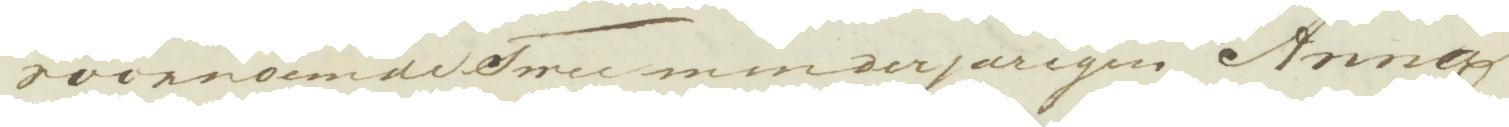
voornoemde Twee minderjarigen Anna
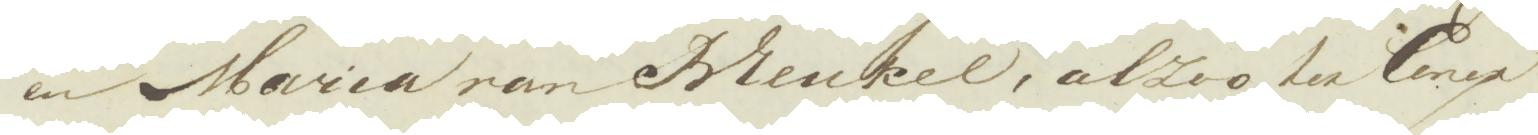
en Maria van Breukel, alzoo ter Eener
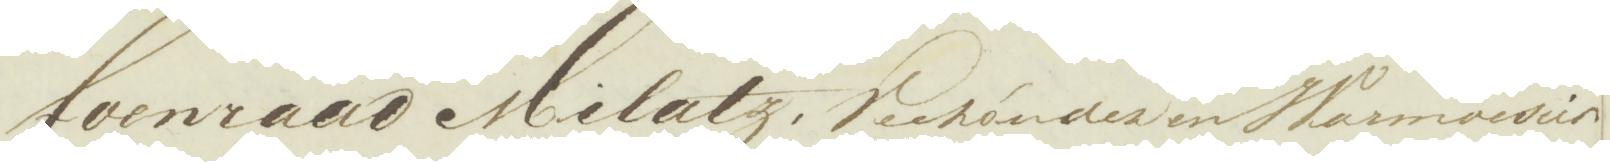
Coenraad Milatz, Veehouder en Warmoesier
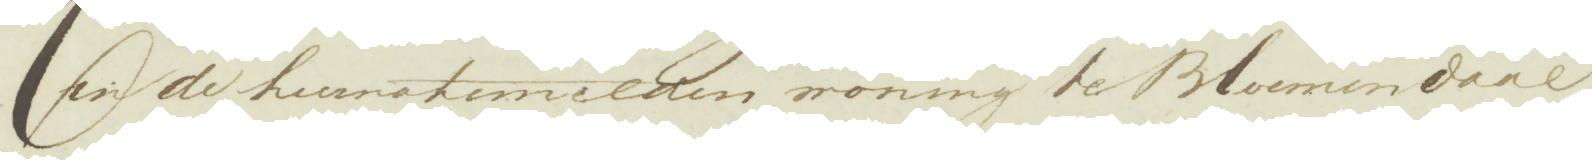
in de hierna te melden woning te Bloemendaal
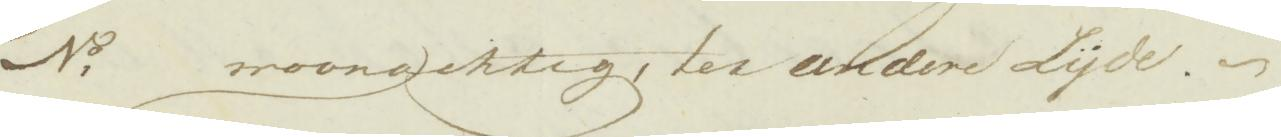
N.o woonachtig, ter andere Zijde.-
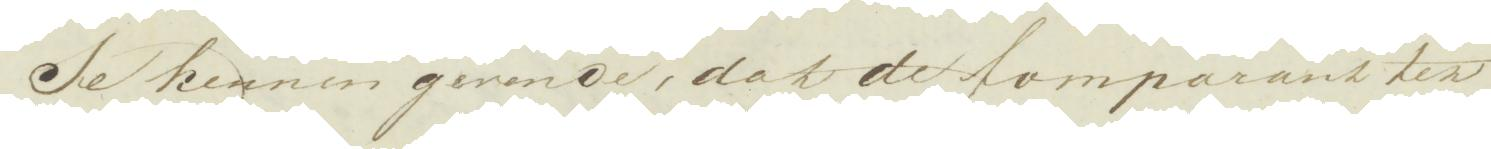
Te kennen gevende, dat de Comparant ter
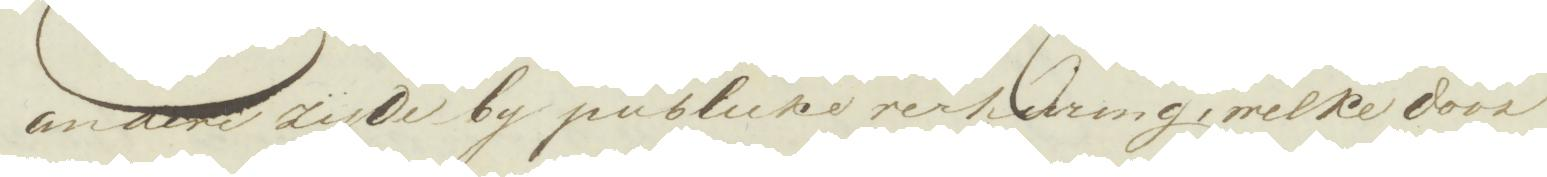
andere zijde by publieke verhuring, welke door
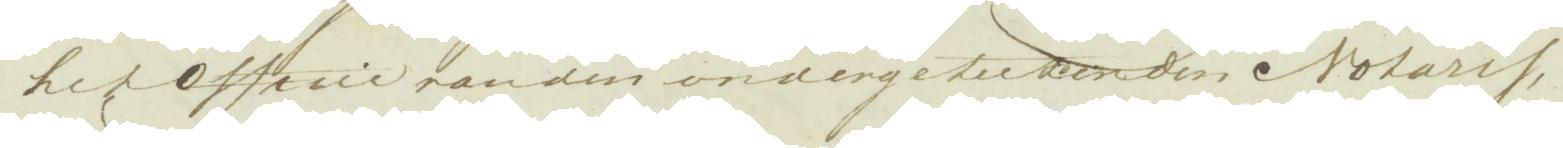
het officie van den ondergeteekenden Notaris,
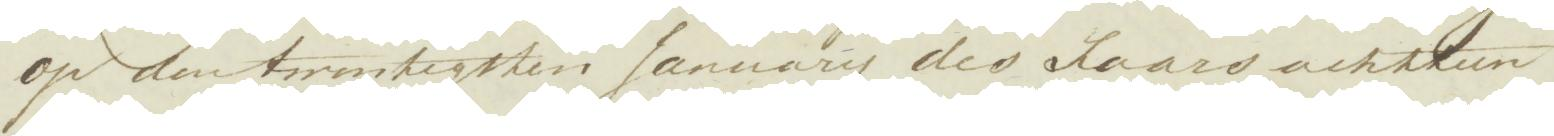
op den twintigsten Januarij des Jaars achttien
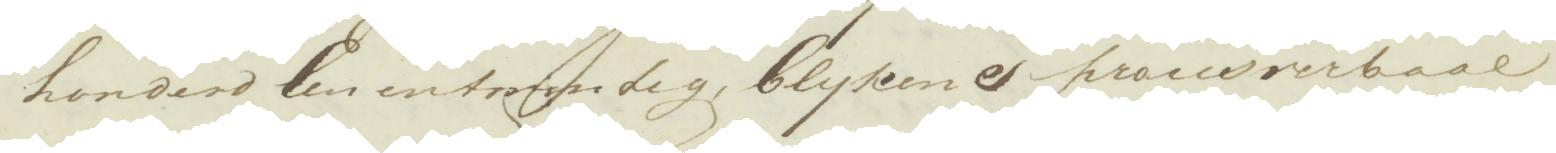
honderd Een en twintig, blykens procesverbaal
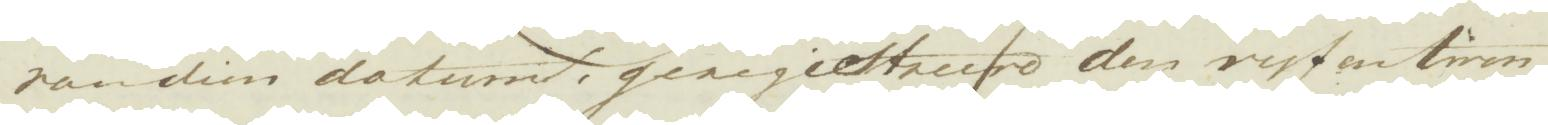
van dien datum, geregistreerd den vyf en twin
